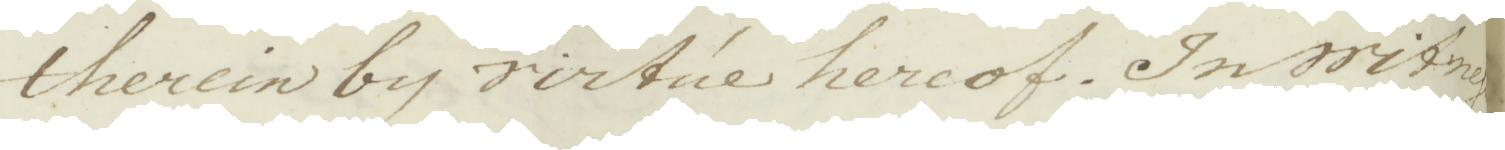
therein by virtue hereof. In witne
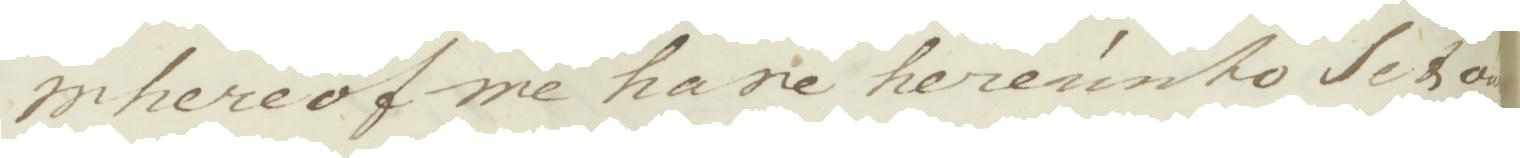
whereof we have hereunto set o
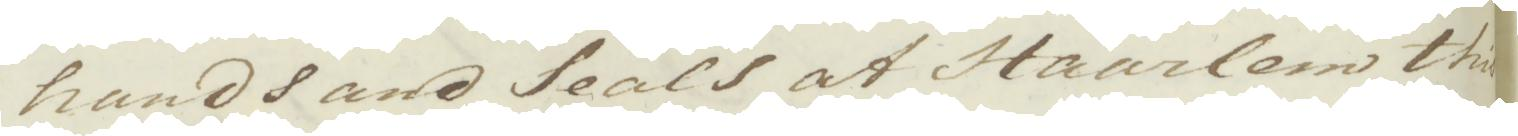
hands and seals at Haarlem thi
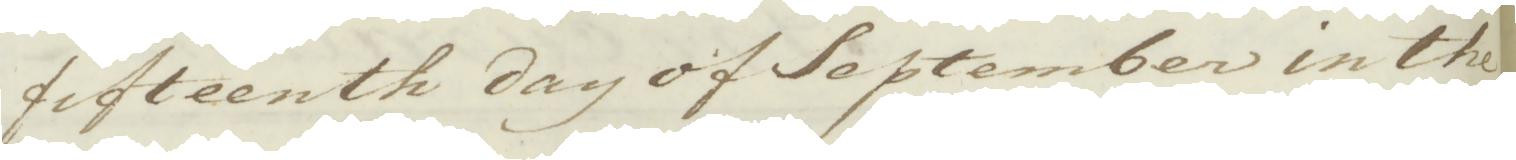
fifteenth day of September in the
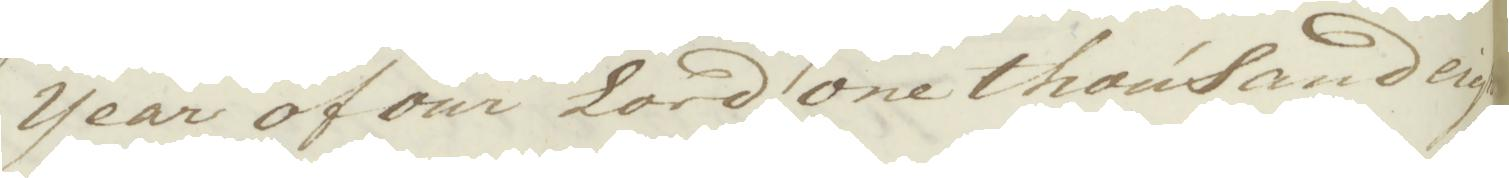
year of our Lord one thousand eig
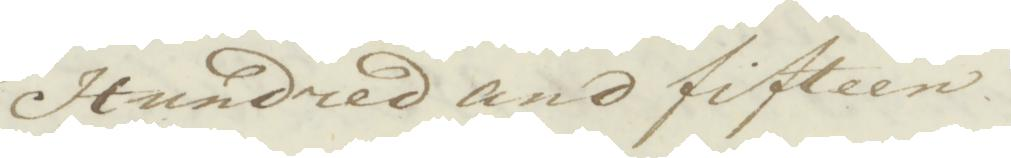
Hundred and fifteen.
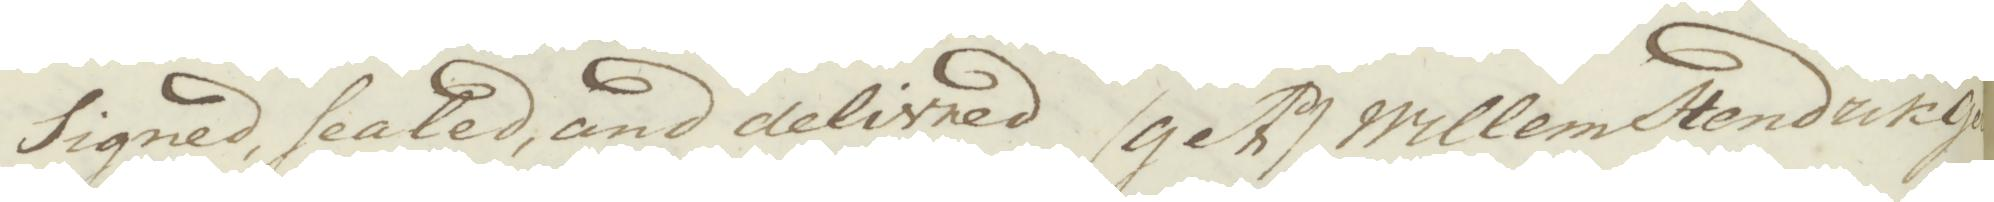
Signed, sealed, and delivred (get) Willem Hendrik Ge
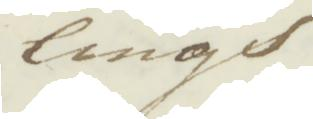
=lings
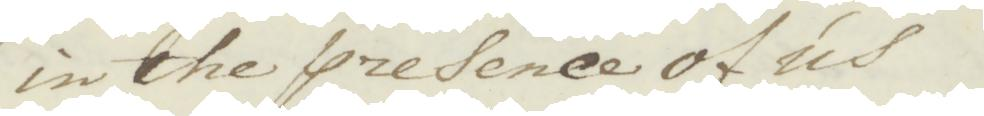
in the presence of us
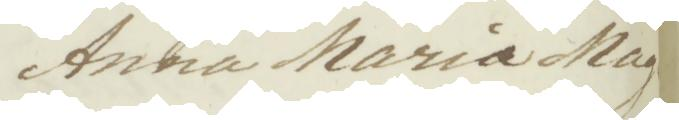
Anna Maria Mag
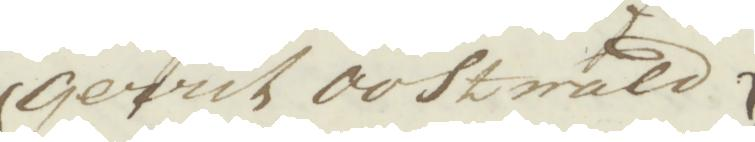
Gerrit Oostwald
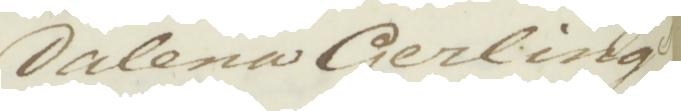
dalena Gerlings
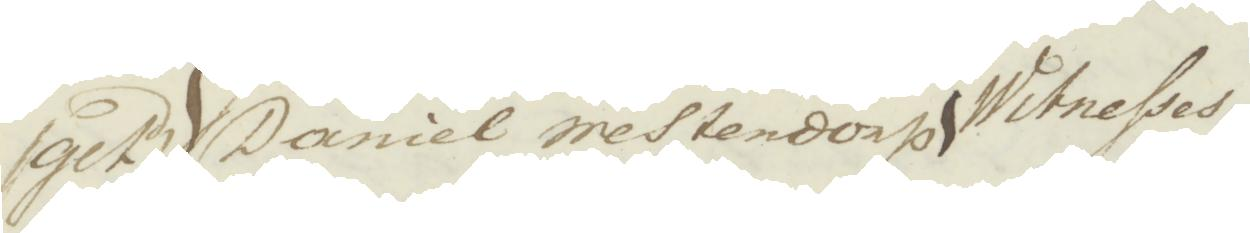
(get) ( Daniel westendorp ) Witnesses
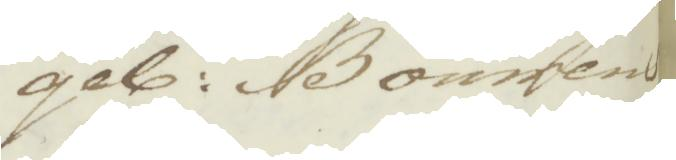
geb: Bouwens
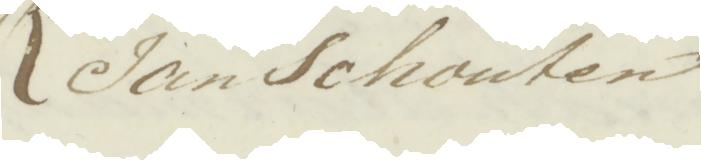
Jan Schouten
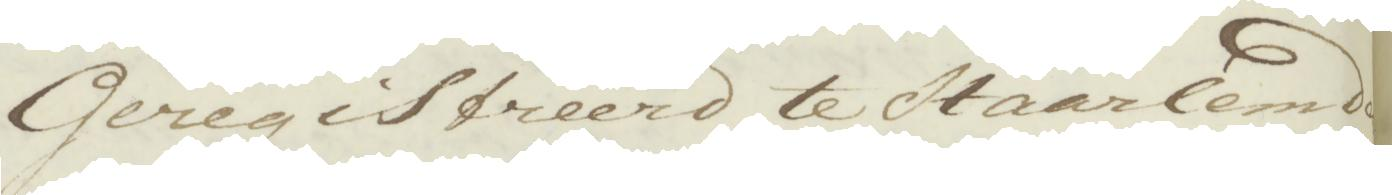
Geregistreerd te Haarlem de
